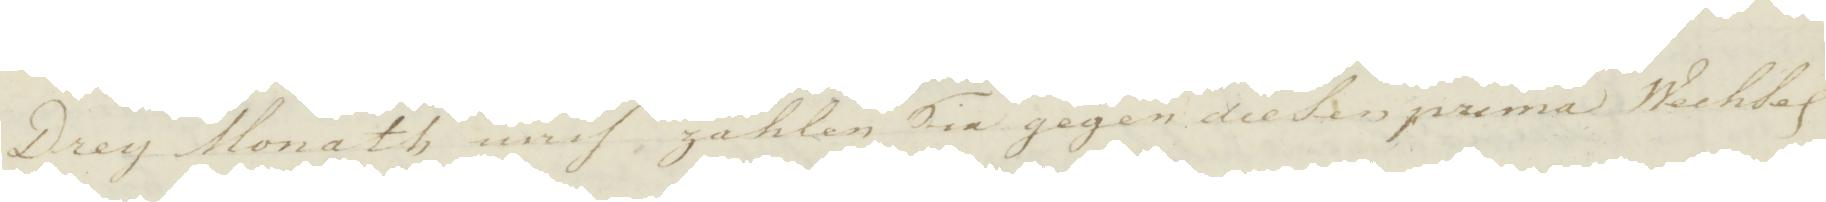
Drey Monath nach, zahlen Sie gegen diesen prima Wechsel
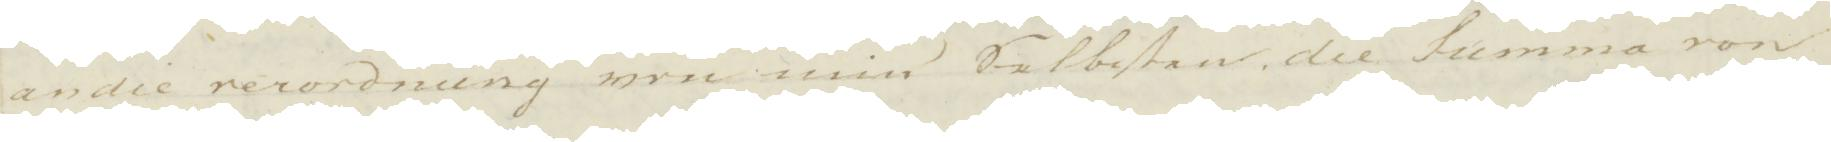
an die verordnung von min Selbisten, die Summa von
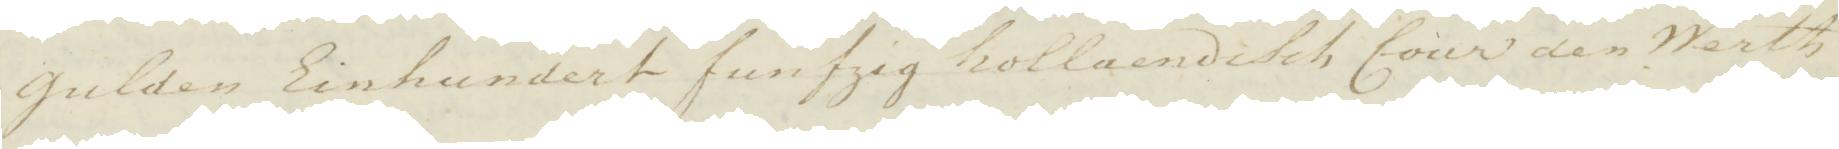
gulden Einhundert funfzig hollaendisch Cour den Werth
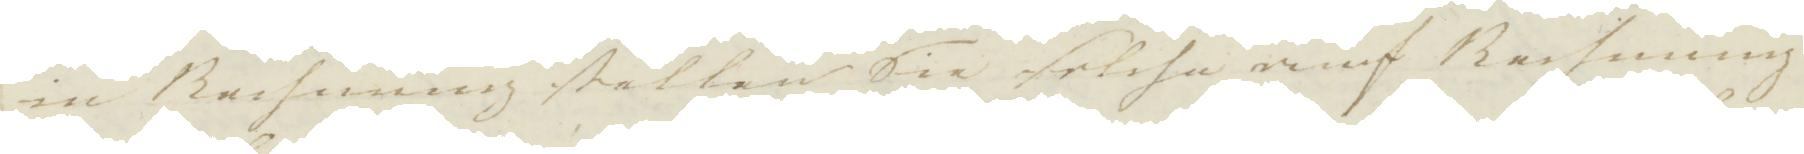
in Rechnung stellen Sie solchen in auf Rechnung
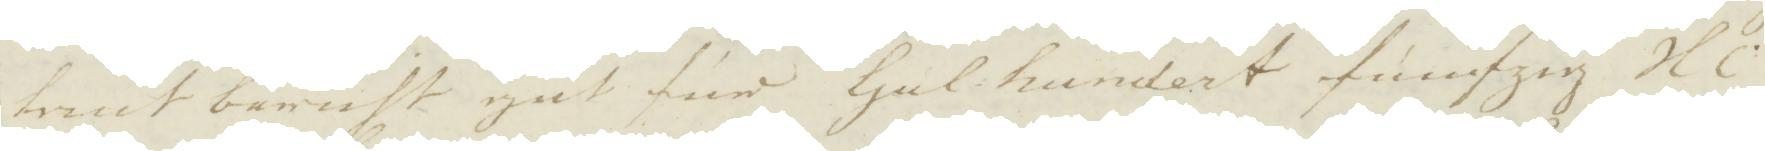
laut bericht gut fur Gul: hundert funfzig Hl
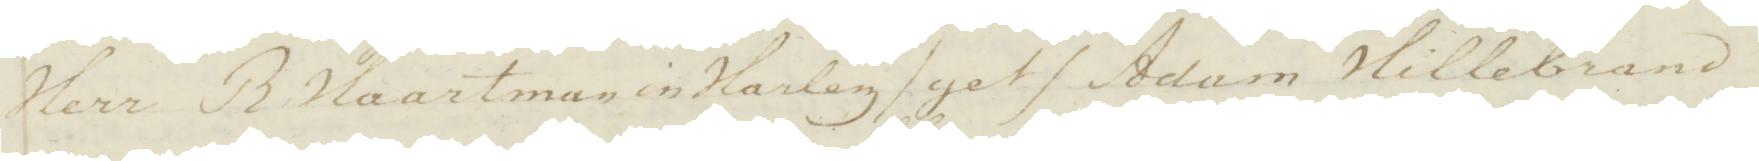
Herr R Haartman in Harlem /get/ Adam Hillebrand
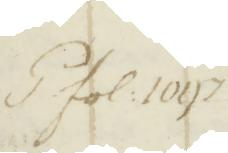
P fol 1097
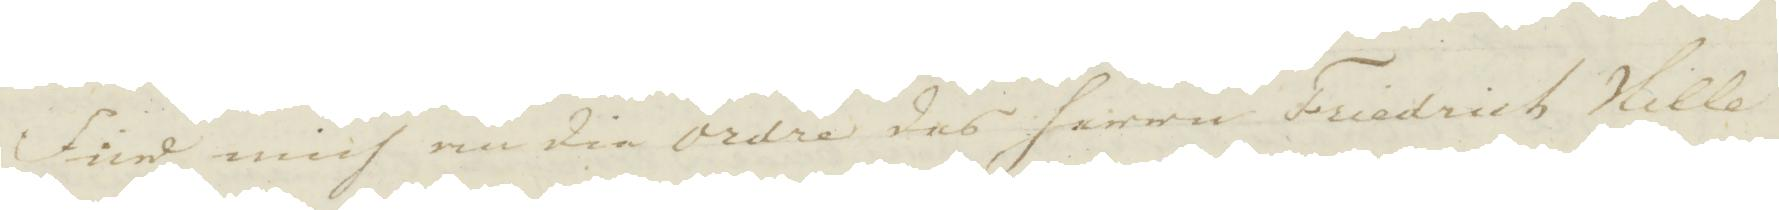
Find mich na die ordre das herrn Friedrich Hille
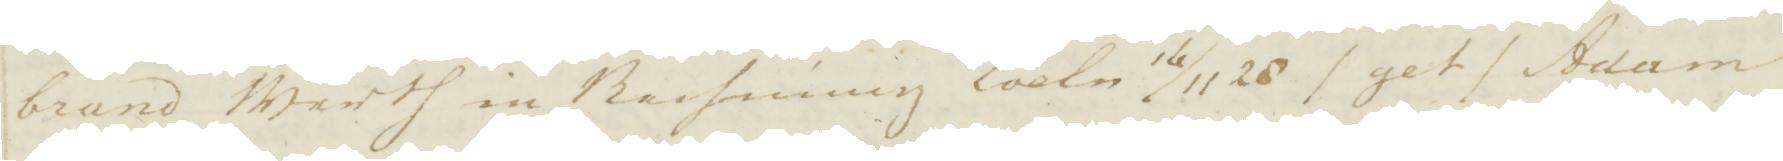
brand Werth in Reichnung Coeln 14/11 28 / get / Adam
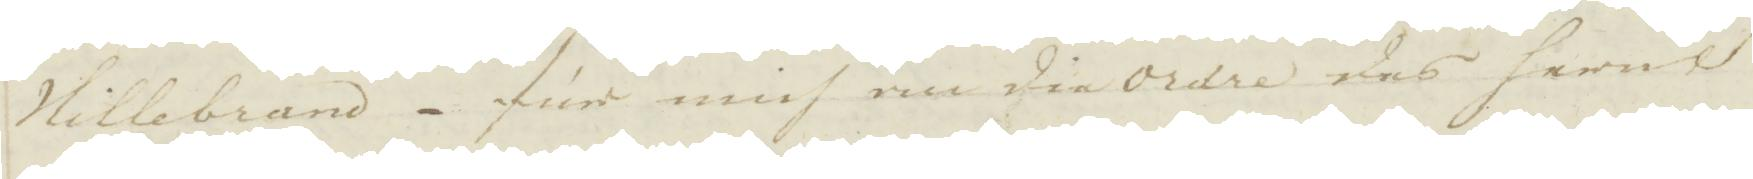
Hillebrand – fur mich an die ordre das Herre
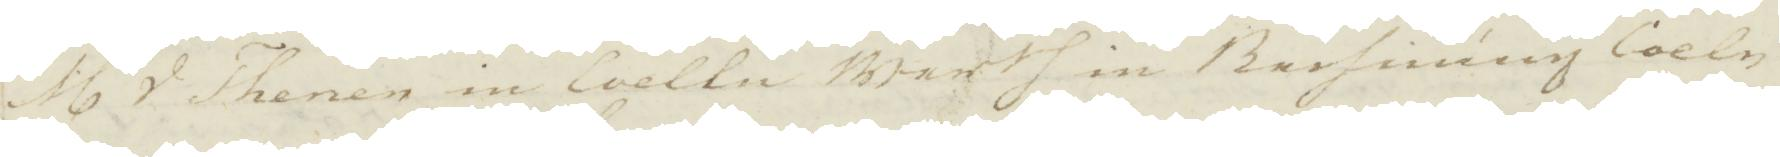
M v Thenen in Coelln Werth in Rechnung Coeln
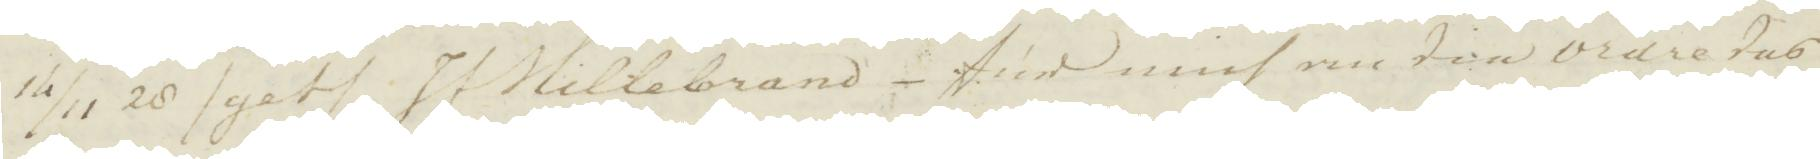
14/11 28 /get/ J: Hillebrand – Aus mich an den ordre das
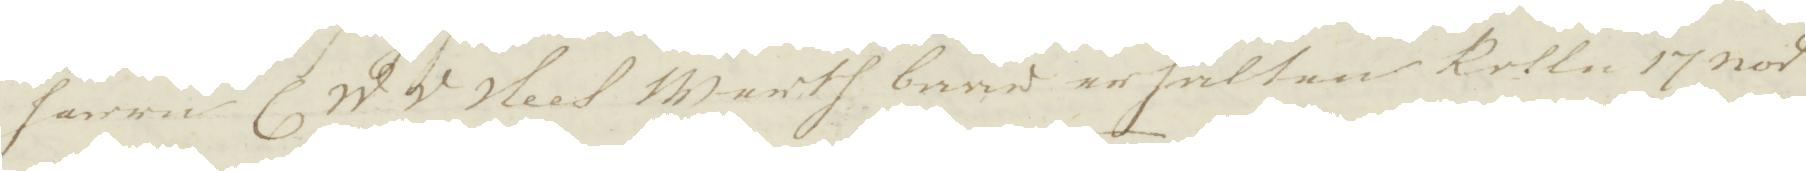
herrn C W. V Hees Werth baad en selten Rolla 17 nov
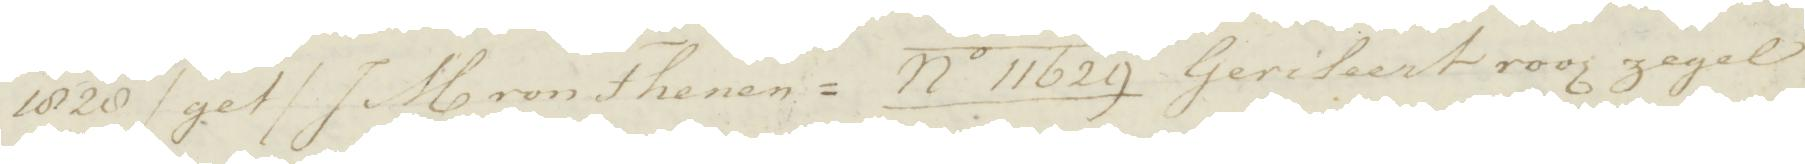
1828 /get/ J M von Thenen = No 11629 Geriseert voor zegel
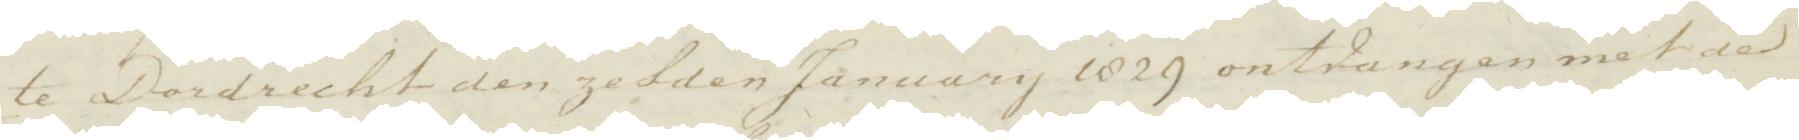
te Dordrecht den zesden January 1829 ontvangen met den
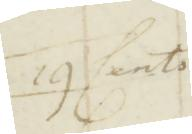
19 Cents
